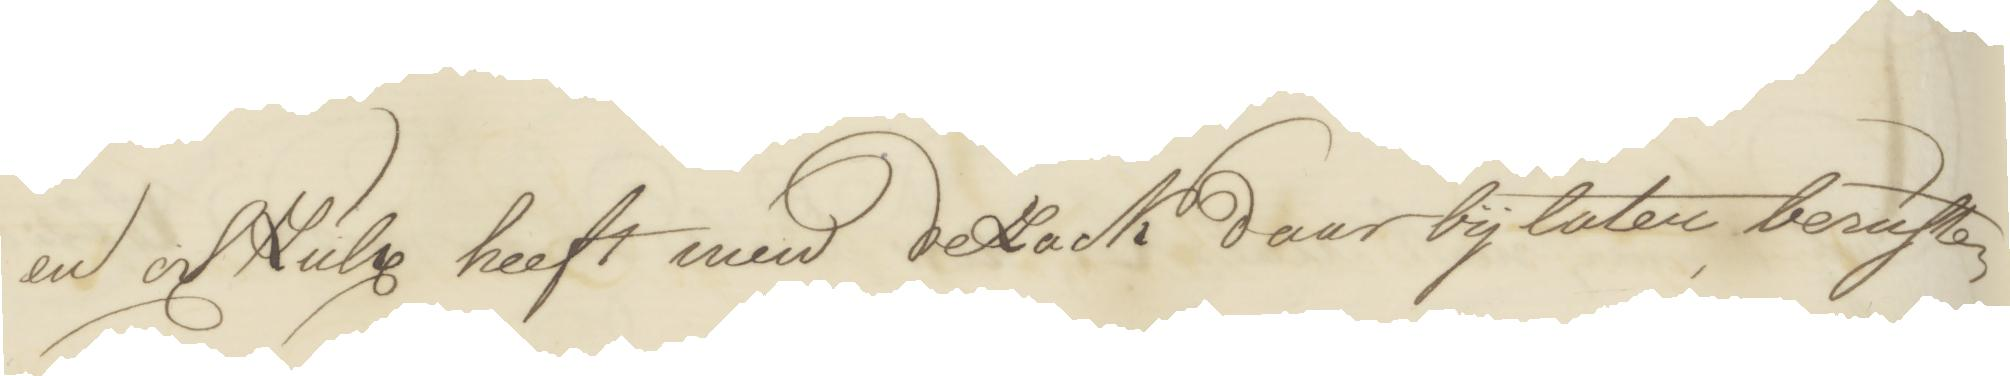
en overzulx heeft men dezack daar bij laten berusten
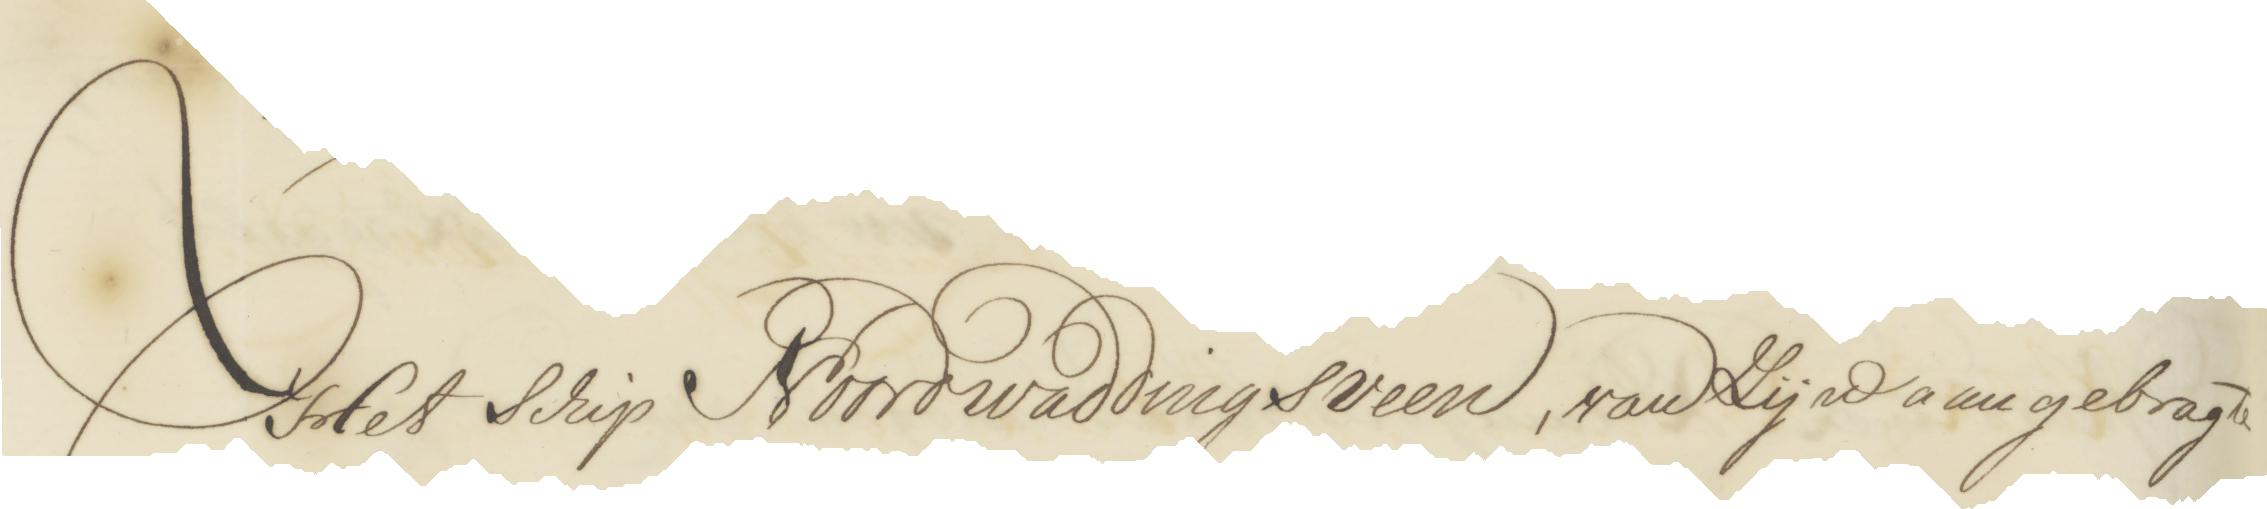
Met schip Noordwaddings veer, van zijn aan gebragte
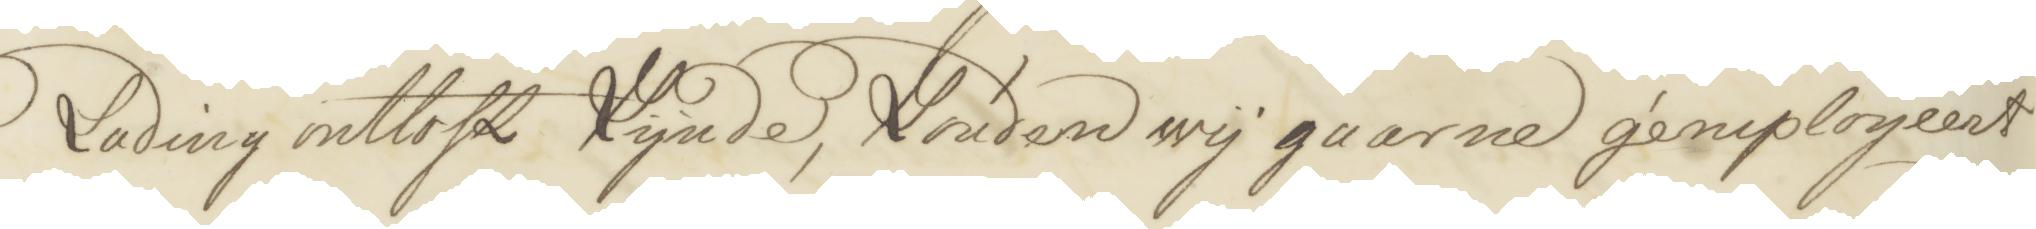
Lading intlost zijnde, zoudan wij gaarne gemeploijeert
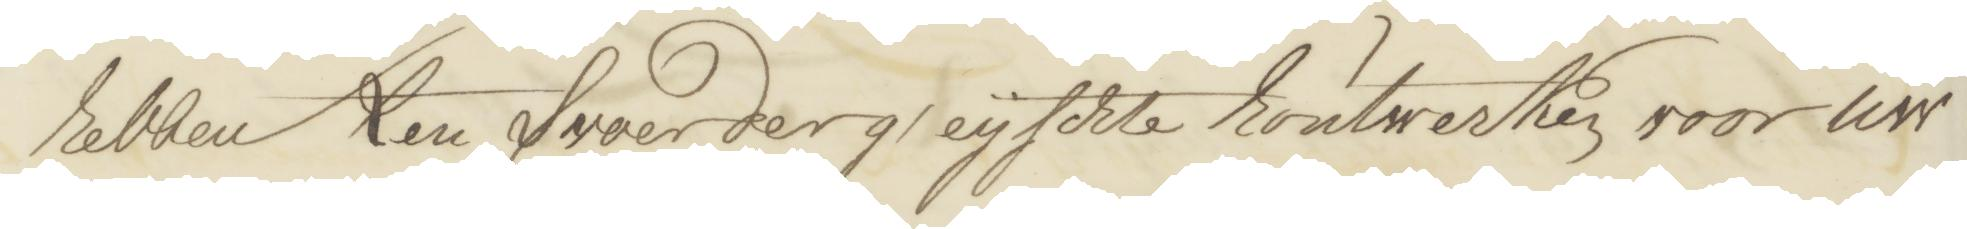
hebben ten vervoerder g’eijschte houtwerken voor uw
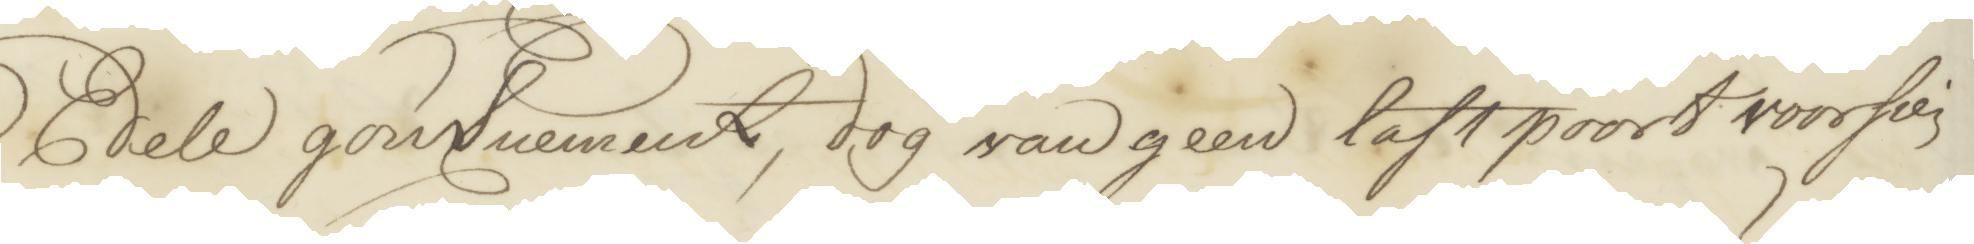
Edele gouverement, dog van geen last poort voorsien
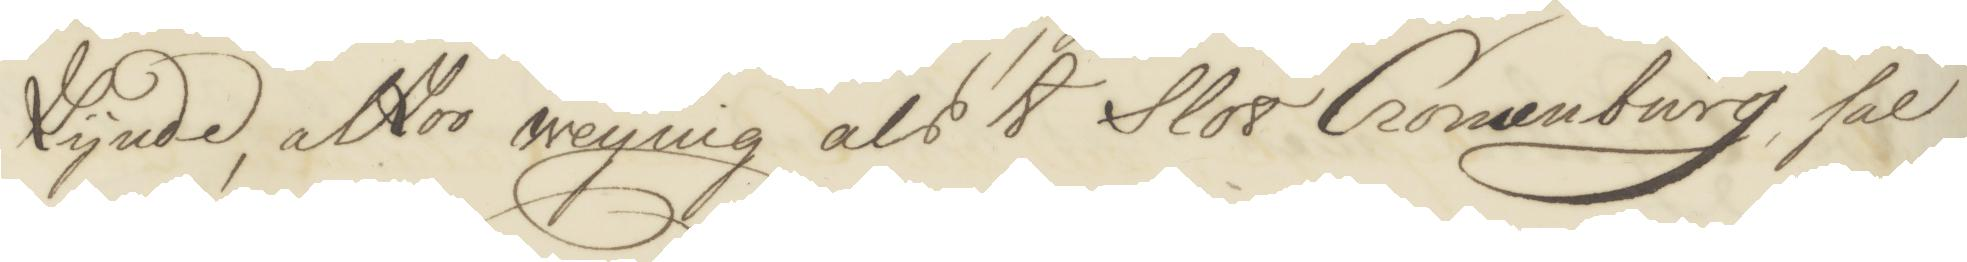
zijnde, alzoo weijnig als ’t slot Cromenburg, sal
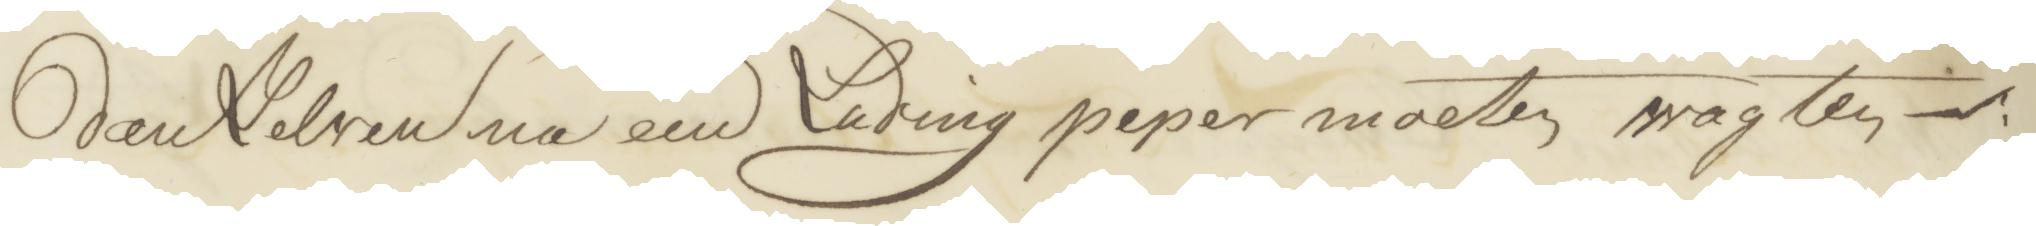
denzelven na een Lading peper moeten wagten —:
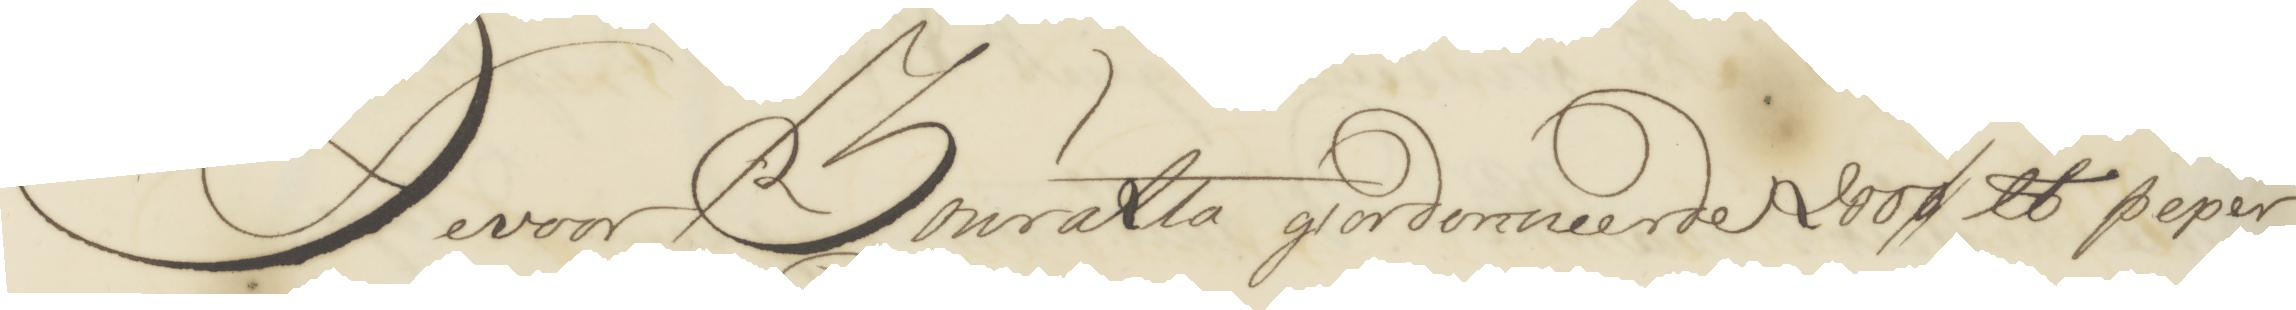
Devoor Bouralta gordonneerde 2000 lb peper
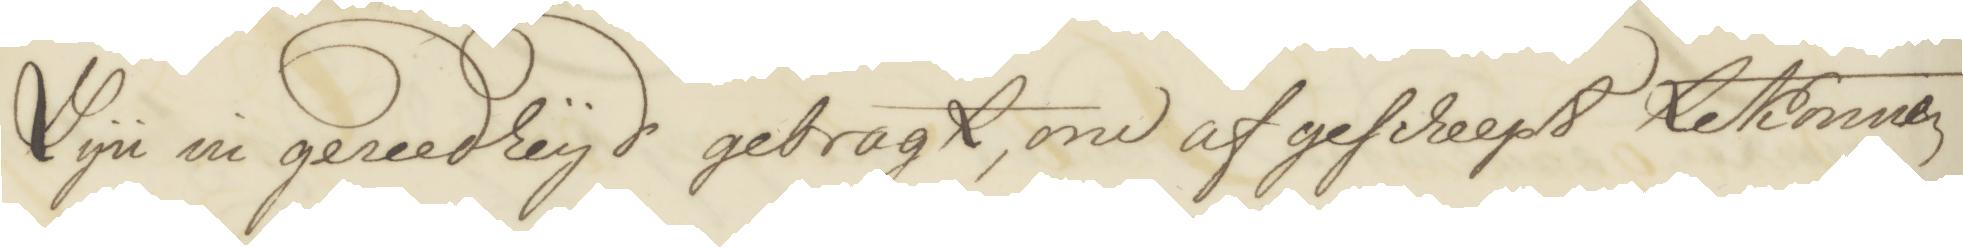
zijn in gereedheijd gebragt, om af gescheept tekonnen
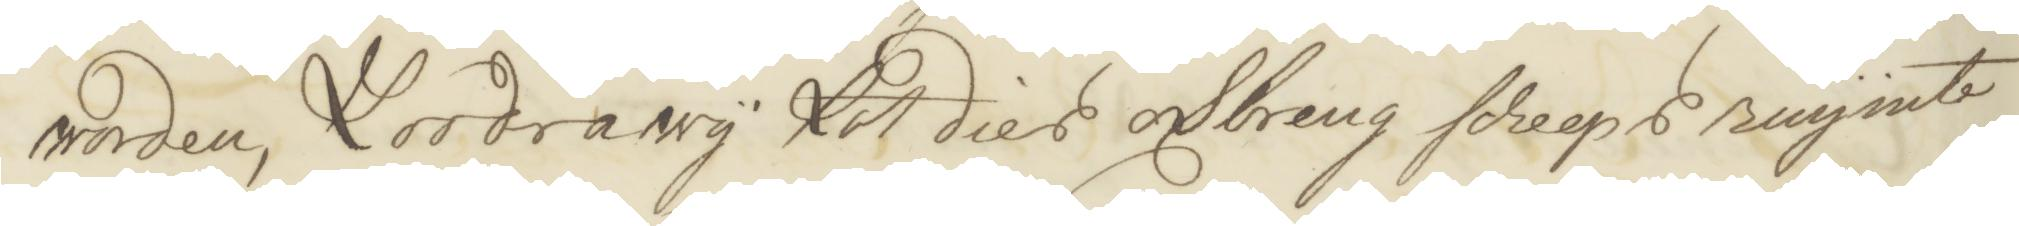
worden, zoodraa wij tot dies overbreng scheeps ruijmte
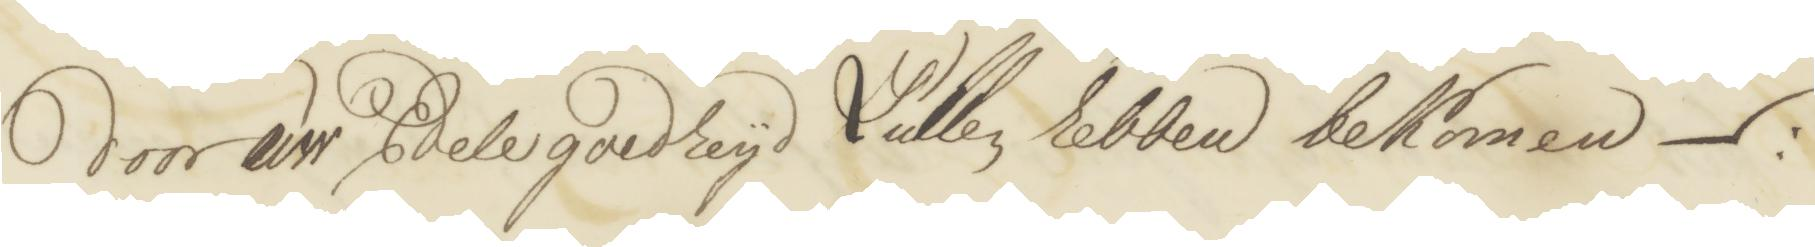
door uw Edele goedheijd zullen hebben bekomen —:
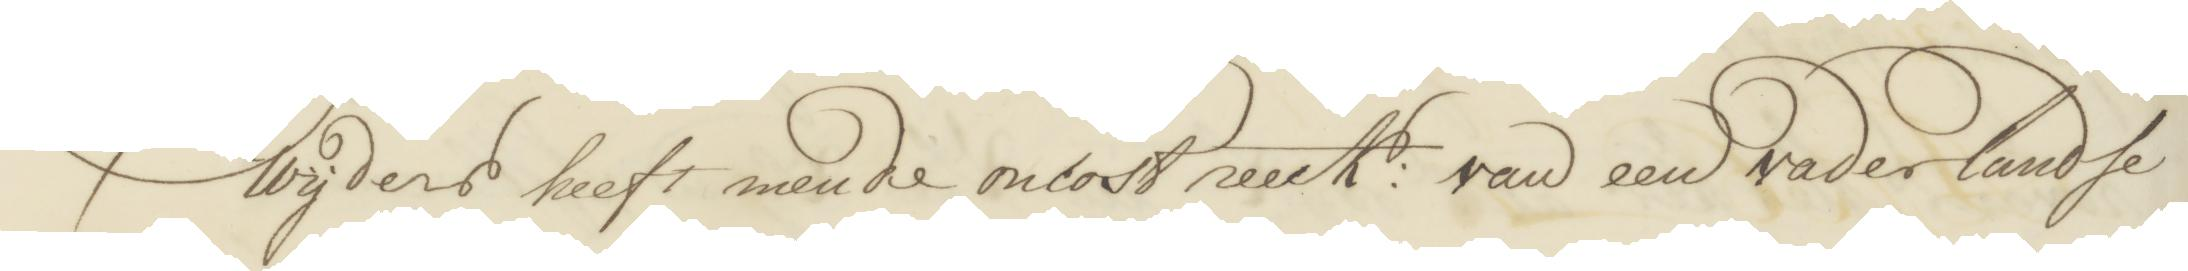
Wijders heeft men de oncost reeck:s van een vaderlandse
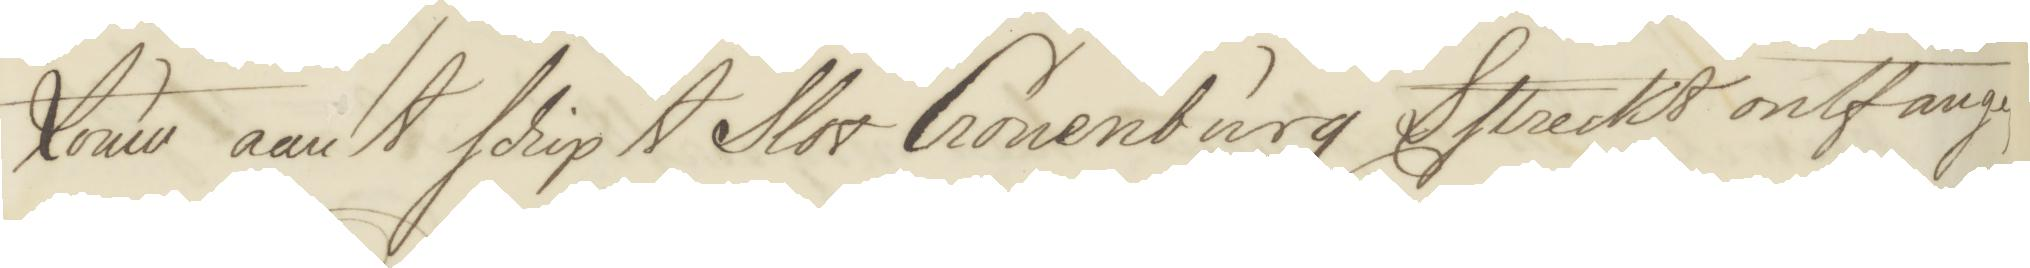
Touw aan ’t schip t Slot Cronenburg verstreckt ontfangen
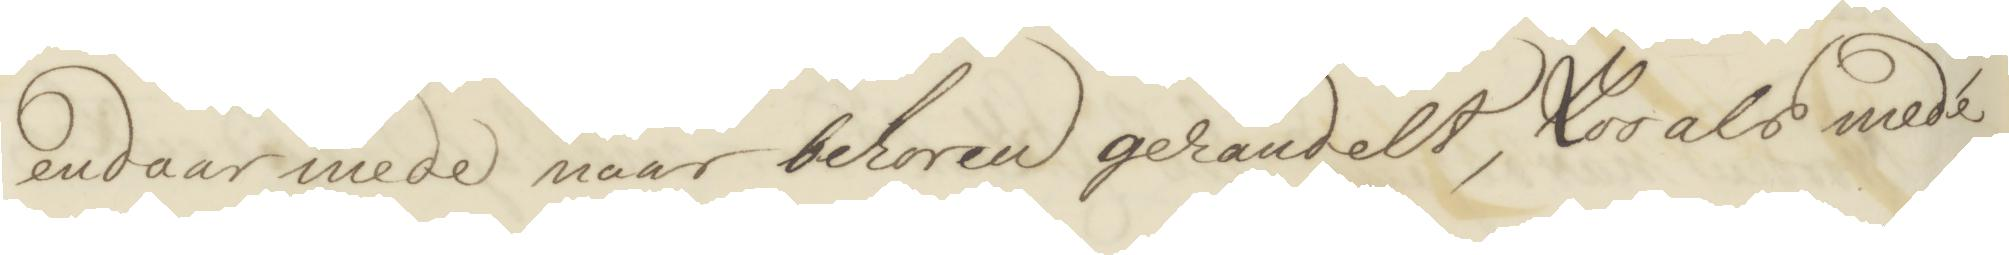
en daar mede naar behoren gehandelt, zoo als mede
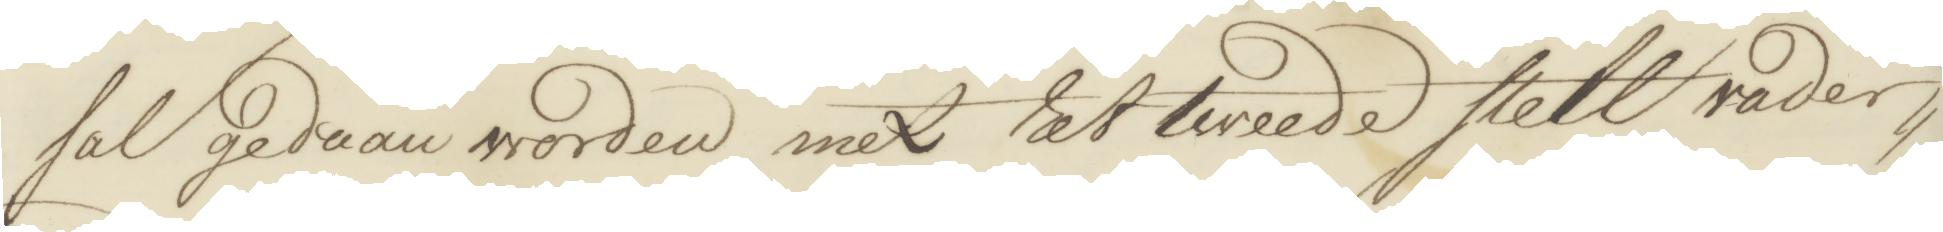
sal gedaan worden met het tweede stell vader„
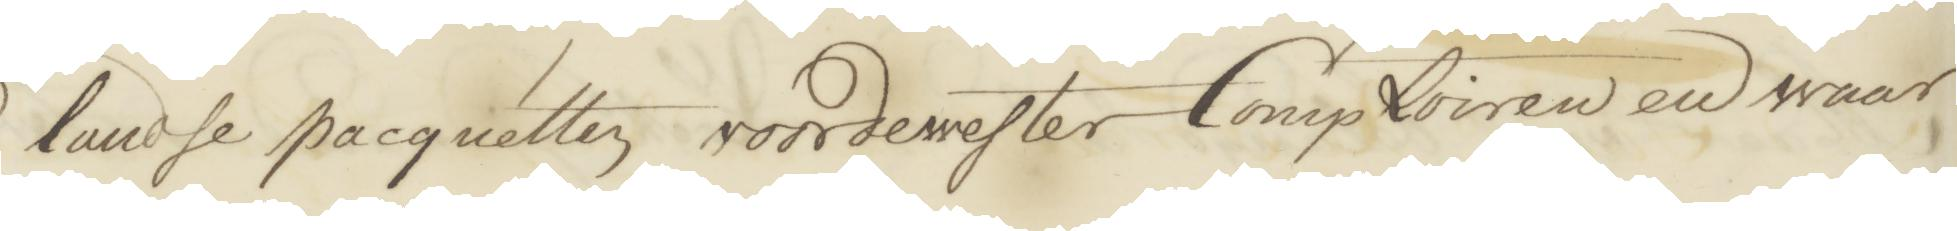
landse pacquetten voordewester Comptoiren en waar
